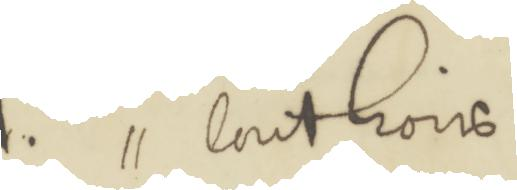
1. „ lonthoir
